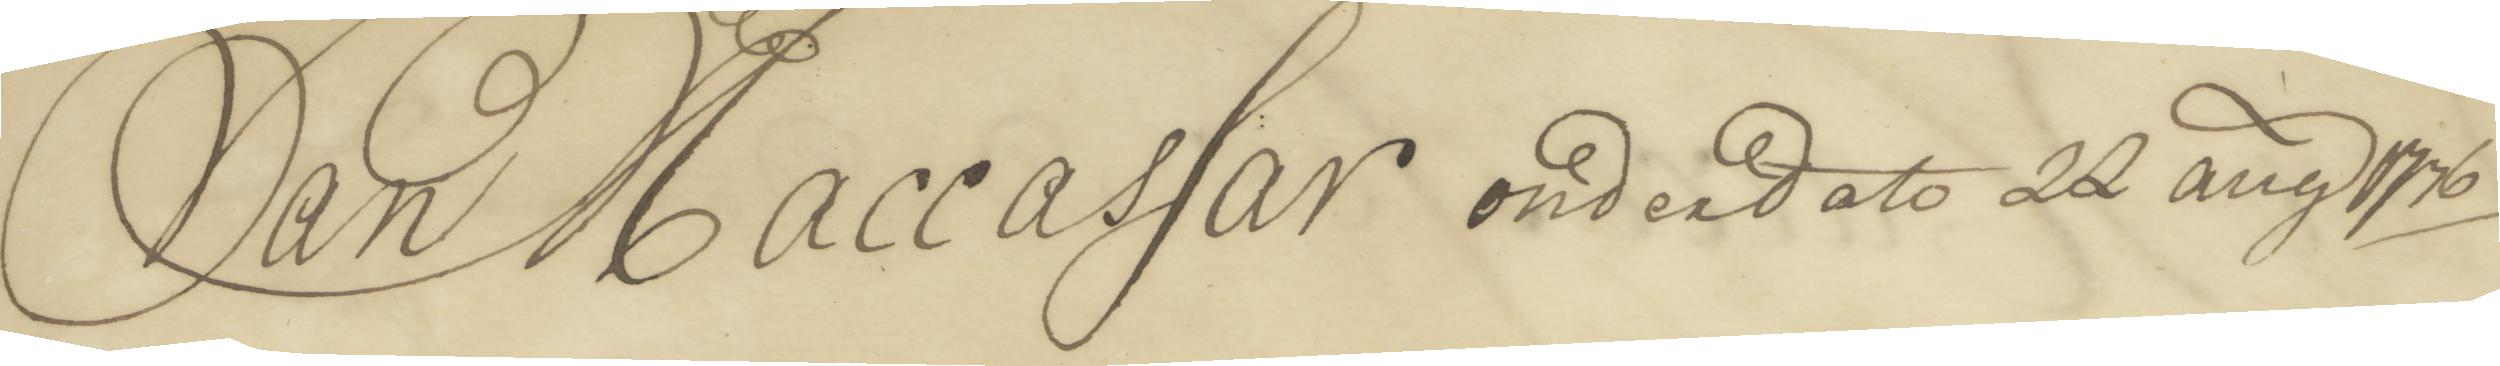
Van Maccassar onder dato 22 aug 1736
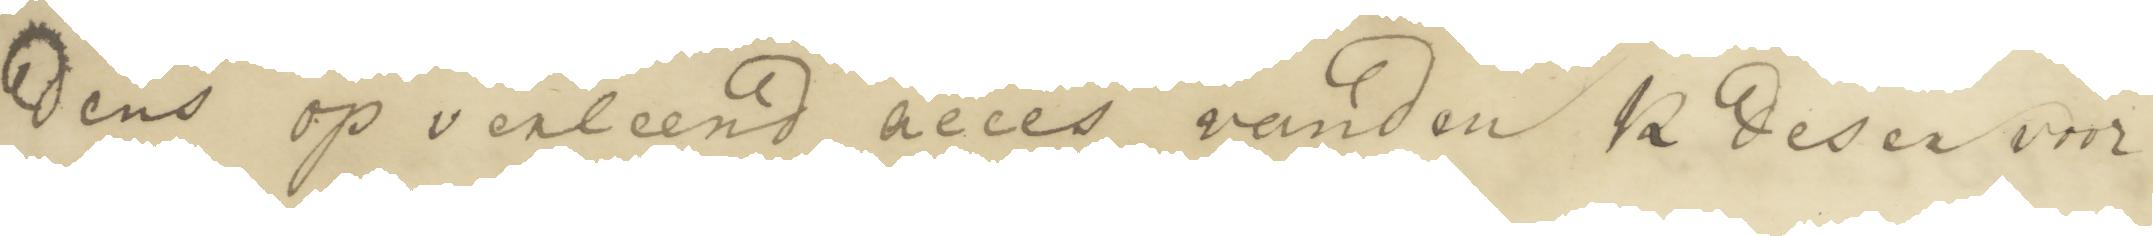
dens op verleend acces vanden 12 deser voor
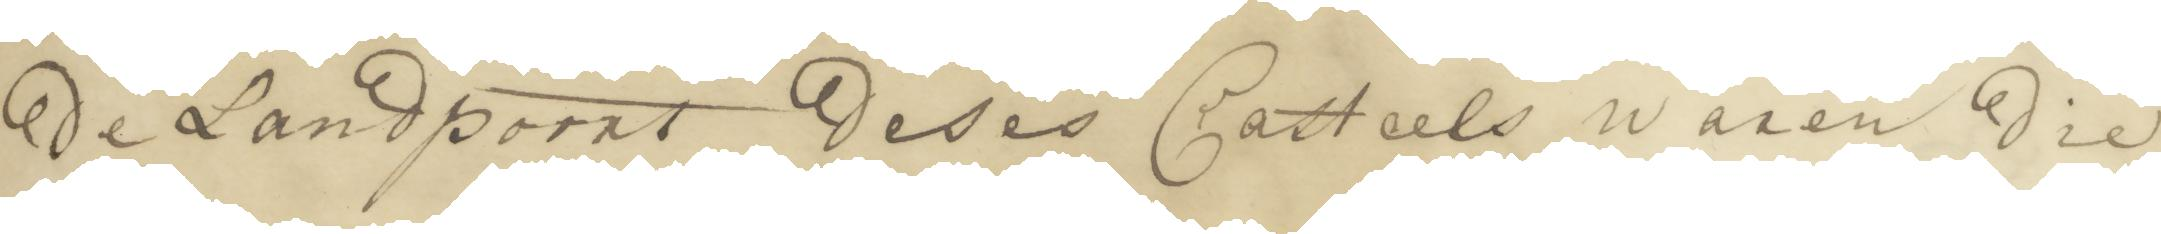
de Landpoort deses Casteels waren die
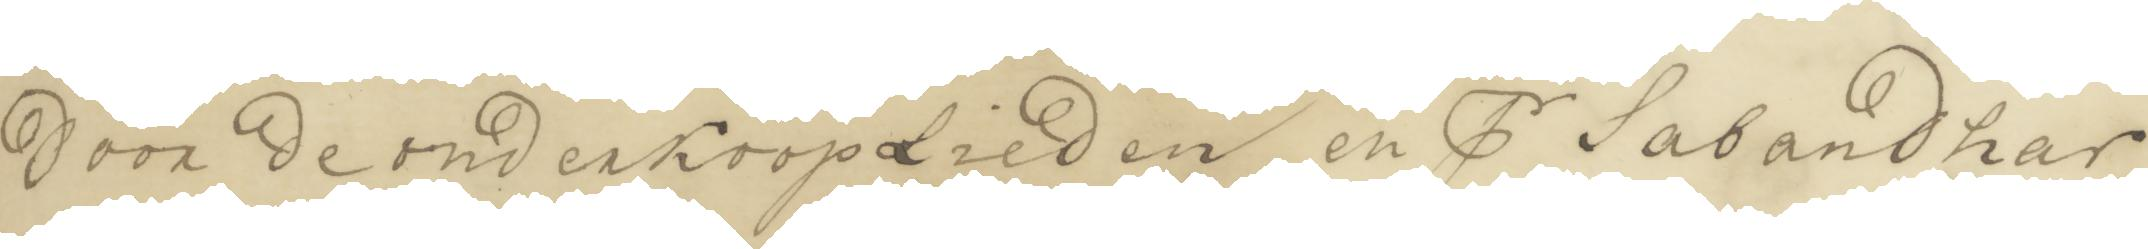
door de onderkooplieden en Pr sabandhar
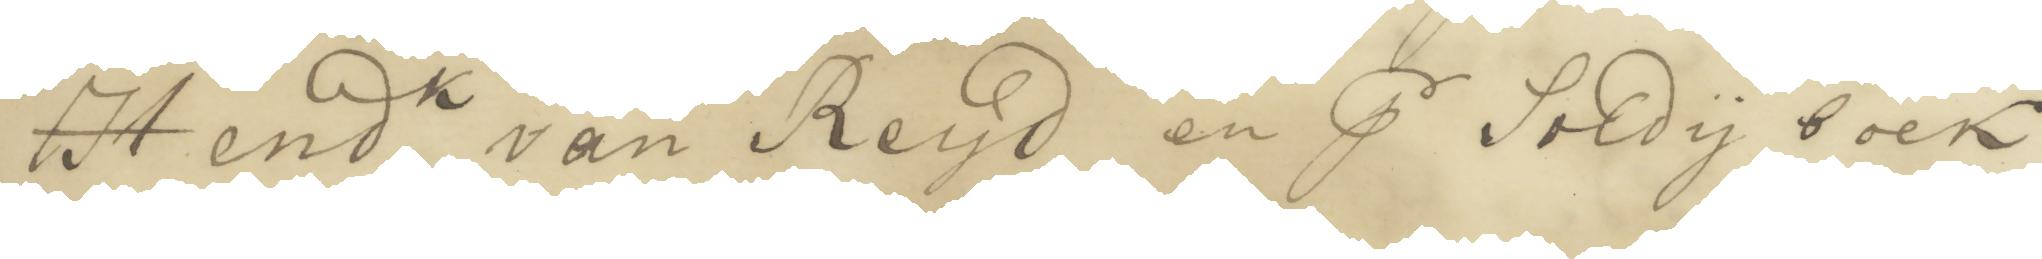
Hendk van Reyd en Pr soldij boek
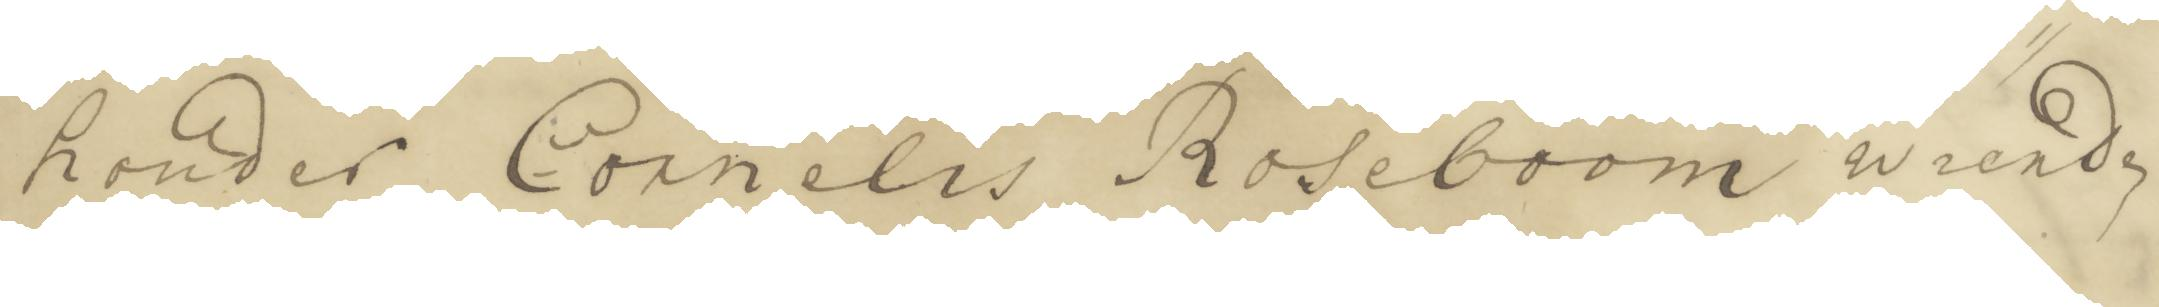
houder Cornelis Roseboom wierden
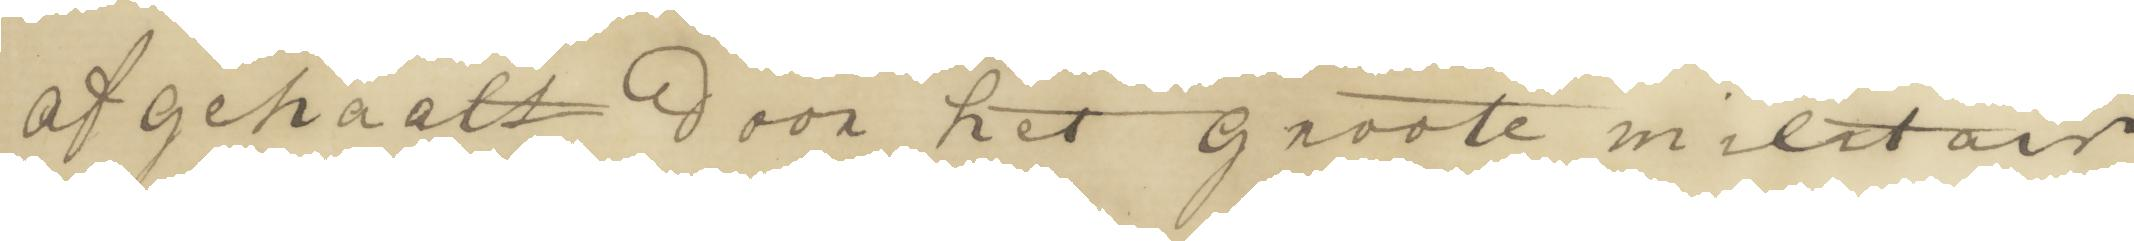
afgehaalt door het groote militair
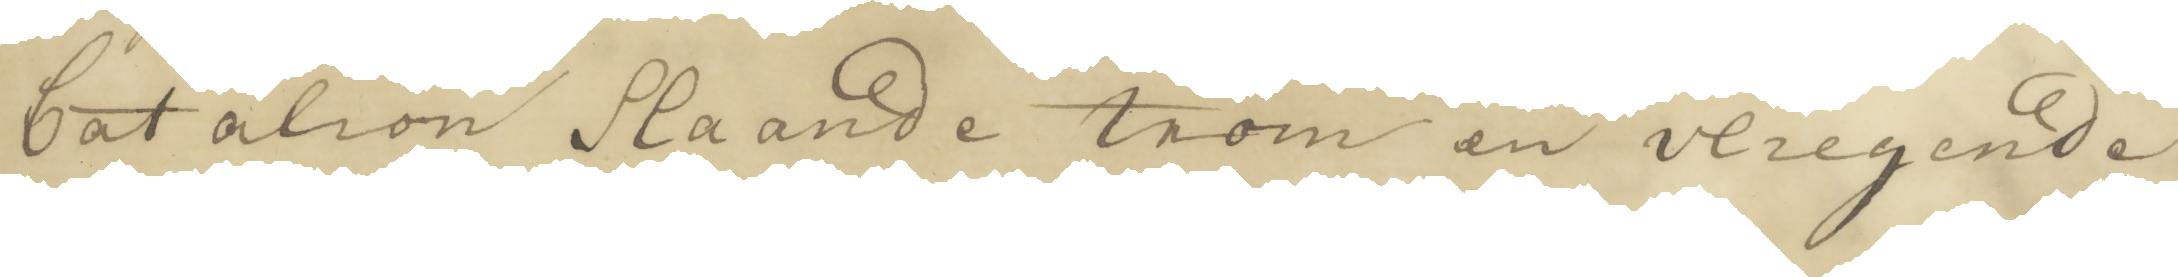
batalion slaande trom en vliegende
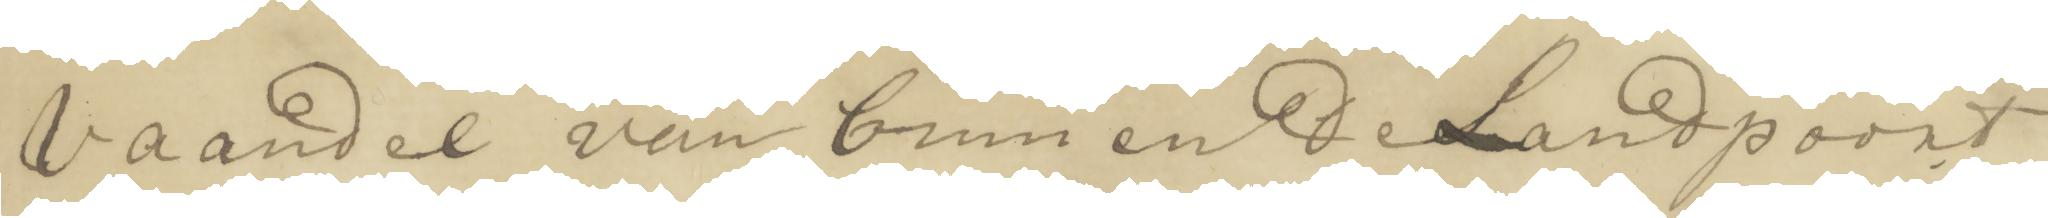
vaandel van binnen de Landpoort
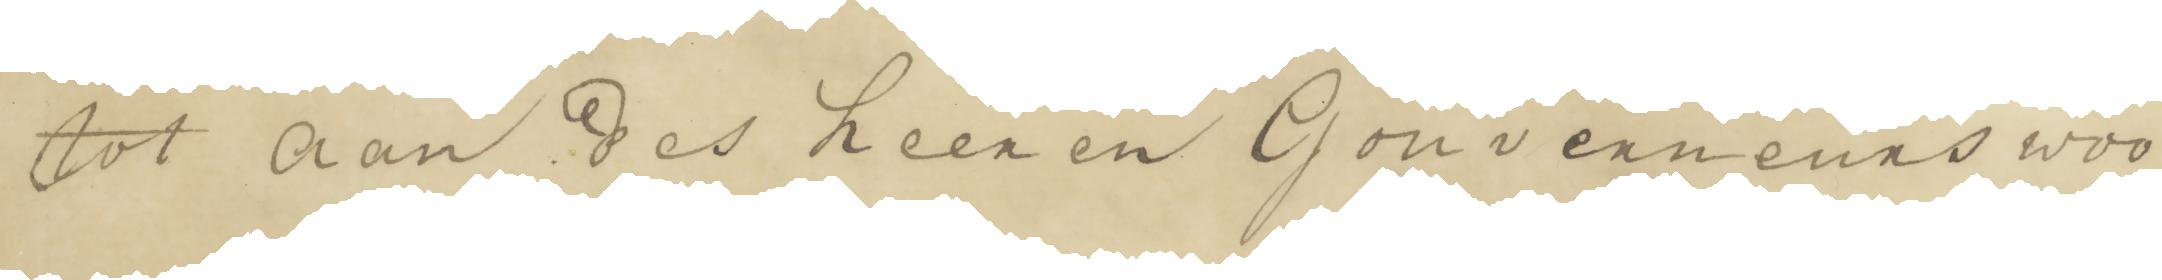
tot aan des heeren Gouverneurs woo
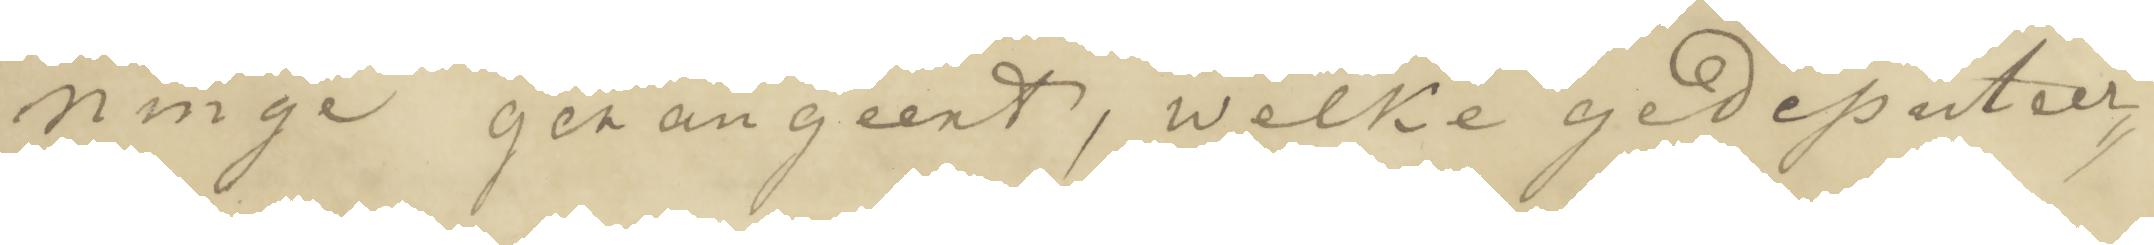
ninge gerangeert, welke gedeputeer„
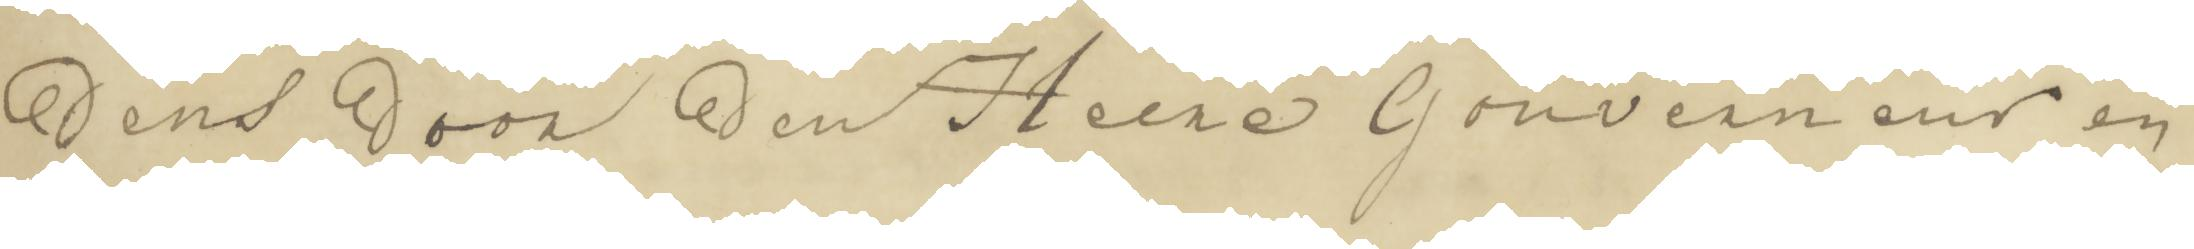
dens door den Heere Gouverneur en
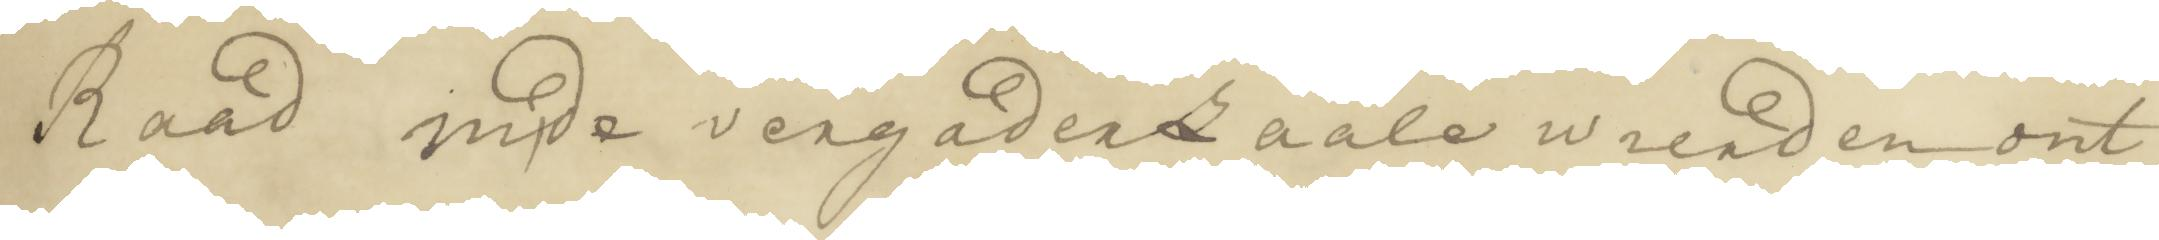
Raad inde vergaderzaale wierden ont
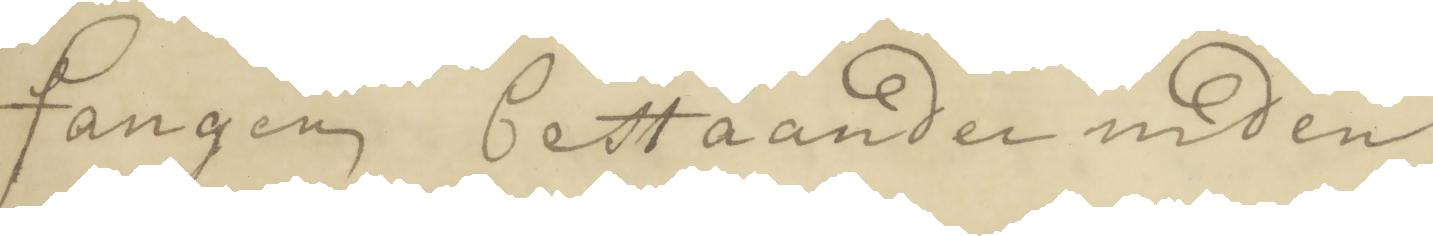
fangen bestaanden in den
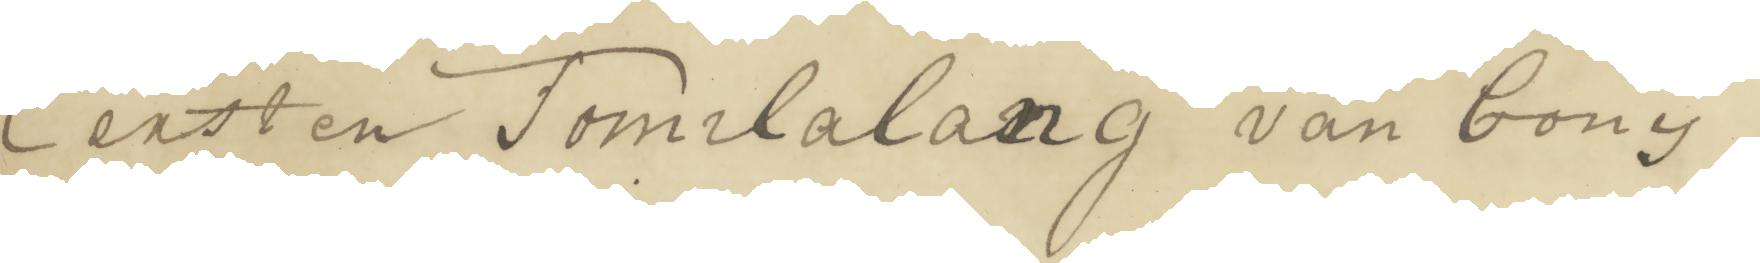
Eersten Tomilalang van bonij
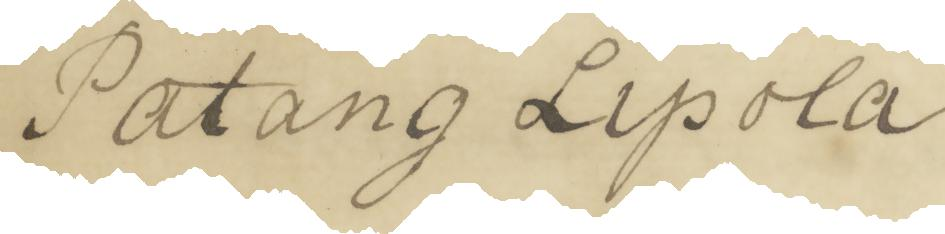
Patang Lipola
